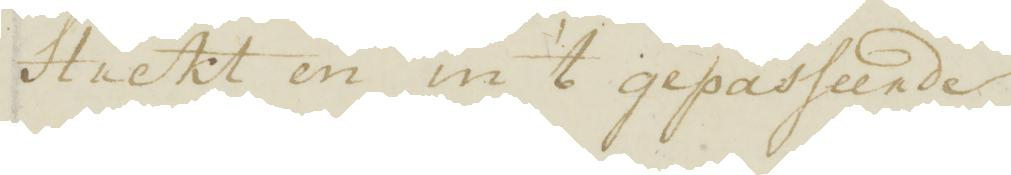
strekt en in ’t gepasseerde
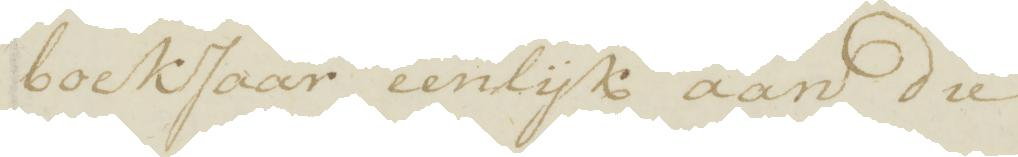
boekJaar eenlijk aan die
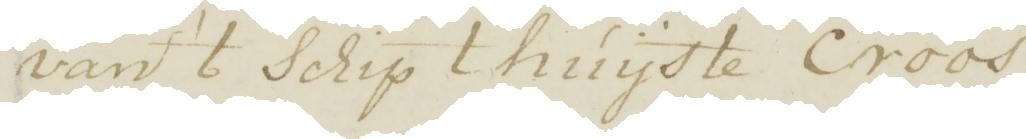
van ’t schip 't huijste Croos
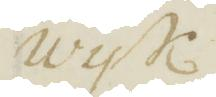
wijk
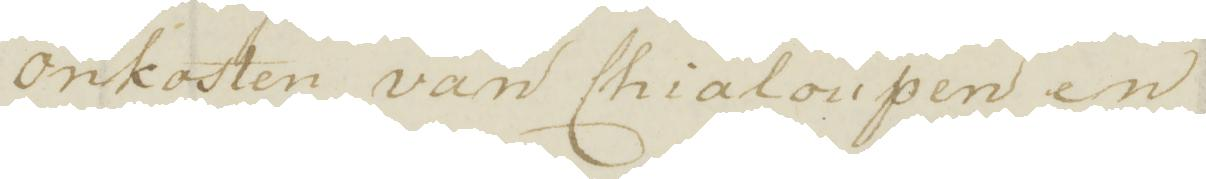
Onkosten van Chialoupen en
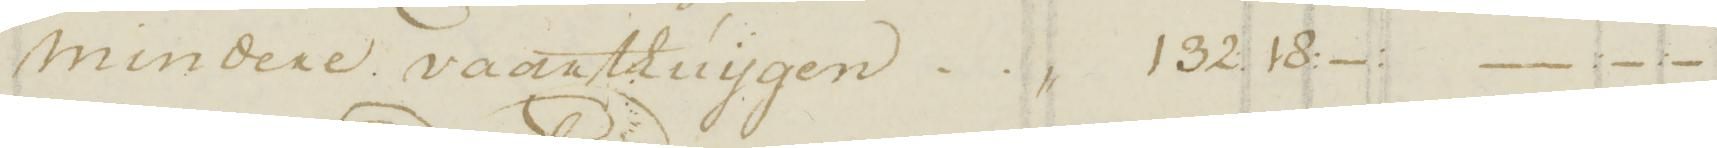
mindere vaarthuijgen . . „ 132: 18: —: —: —: —
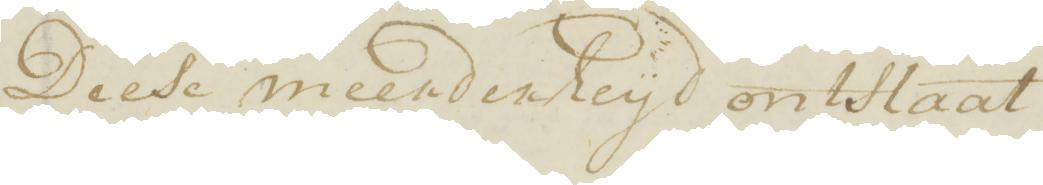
Deese meerderheijd ontstaat
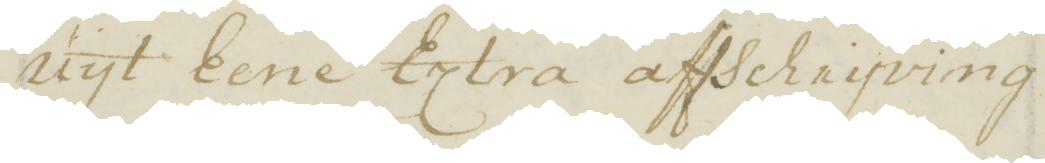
uijt Eene Extra affschrijving
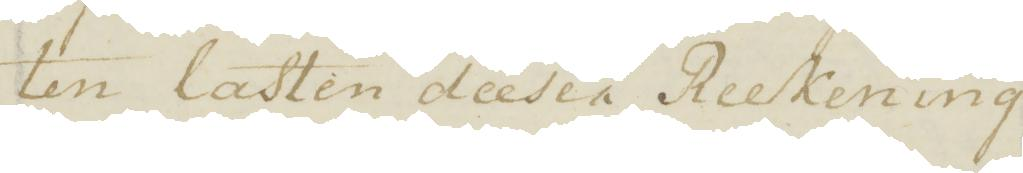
ten lasten deeser Reekening
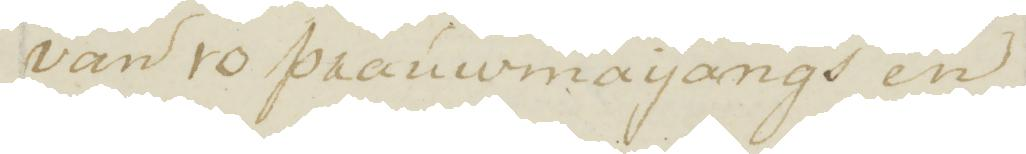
van 10 prauwmaijangs en
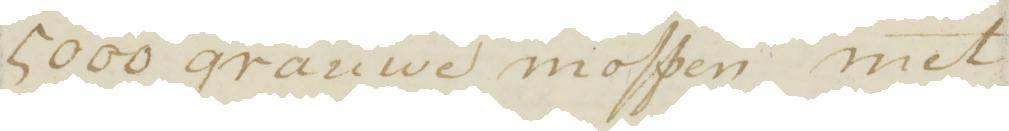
5000 grauwe moppen met
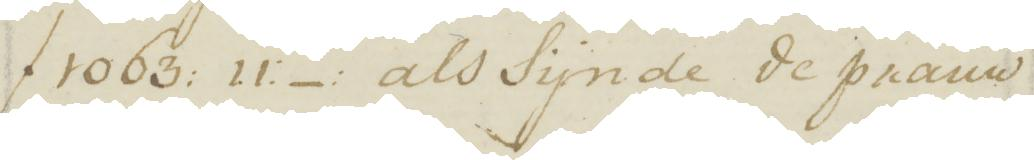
ƒ1063: 11: —: als sijnde de prauw
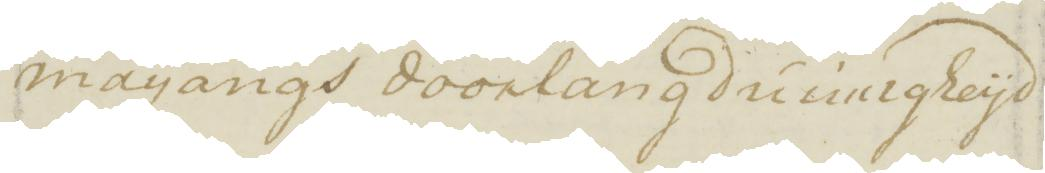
maijangs doorlang duurigheijd
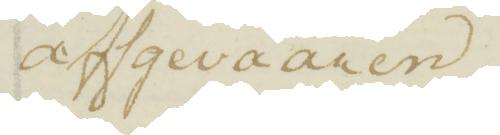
affgevaaren _
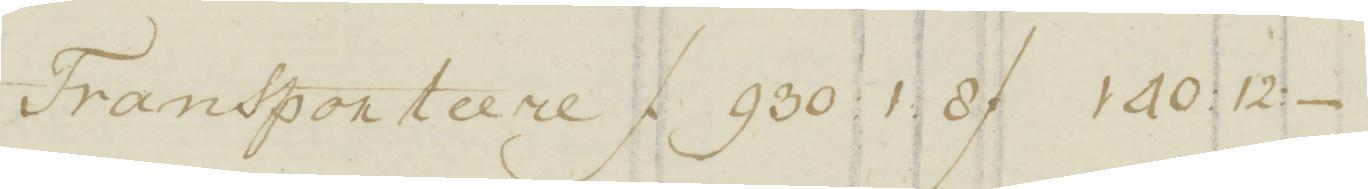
Transporteere ƒ 930: 1: 8 ƒ 140: 12: —
